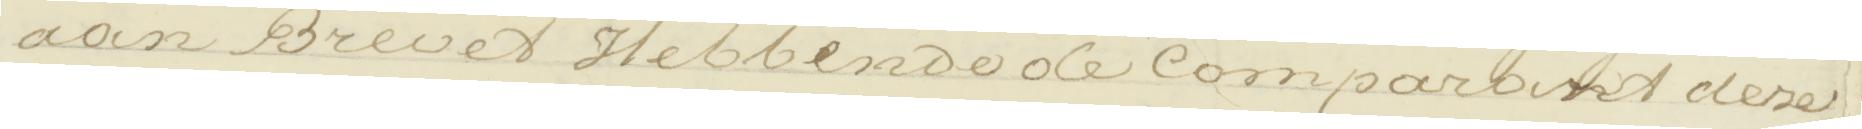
aan Brevet Hebbende de comparant deze
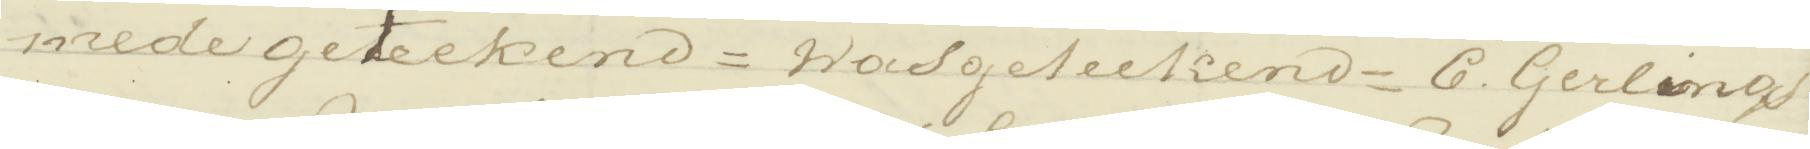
mede geteekend = was geteekend = C. Gerlings
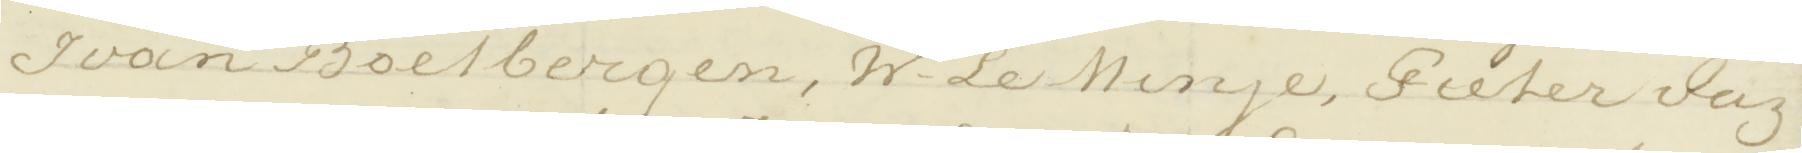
I van Boetbergen, W- Le minje, Pieter van
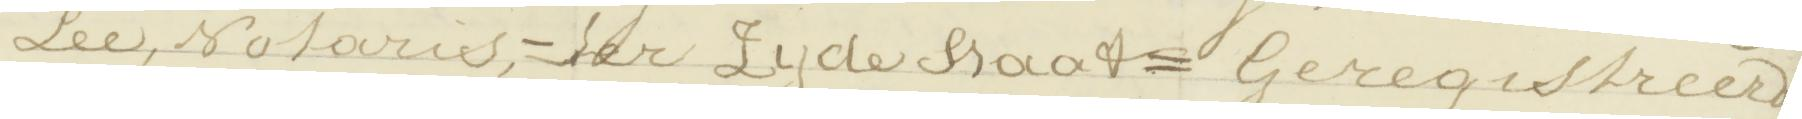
Lee, Notaris, =ter zyde staat= Geregistreerd
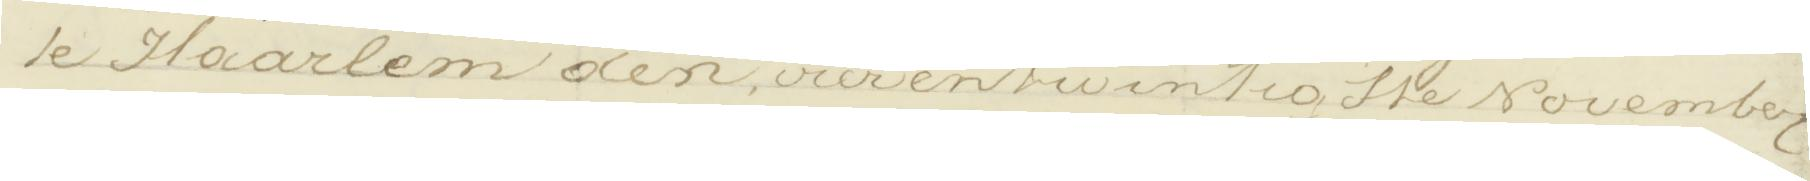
te Haarlem den vier en twintigste November
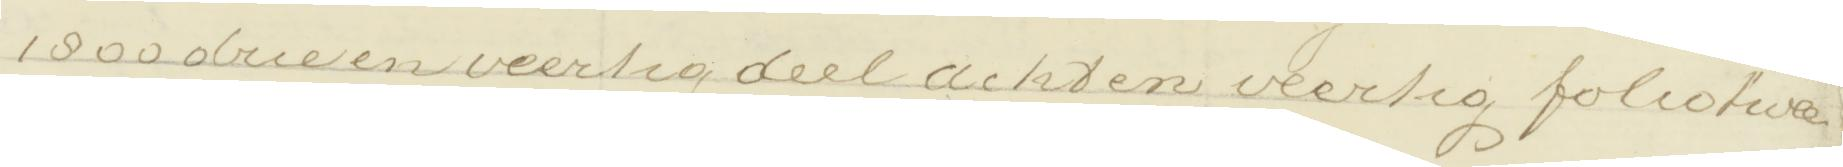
1800 drie en veertig deel acht en veertig folio twee
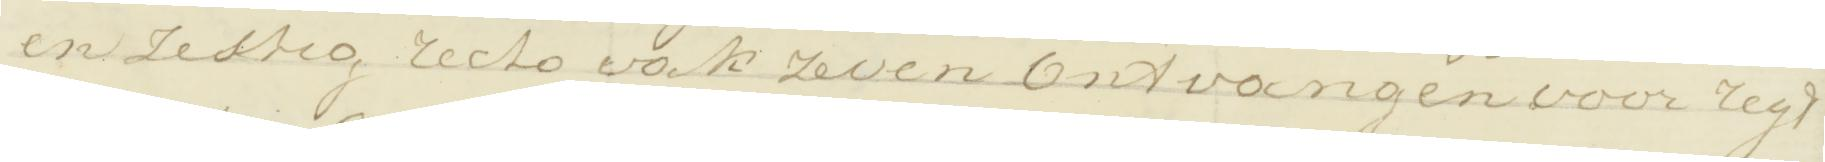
en zestig, recto vak zeven ontvangen voor regt
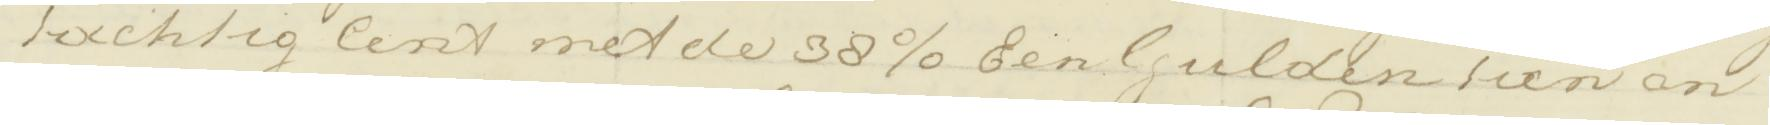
tachtig cent met de 38% Een Gulden tien en
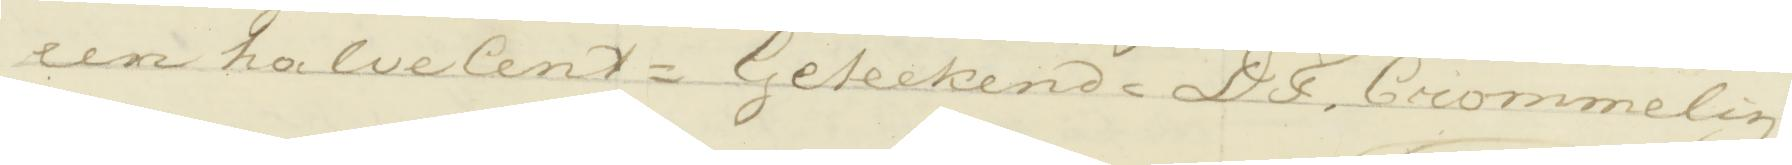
een halve cent =Geteekend= DF, Crommelin
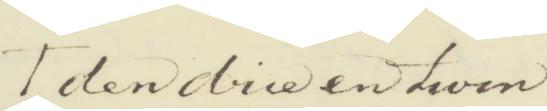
¶ den drie en twin
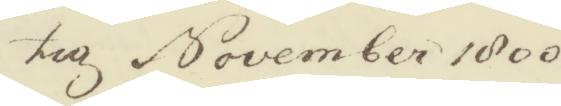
tig November 1800
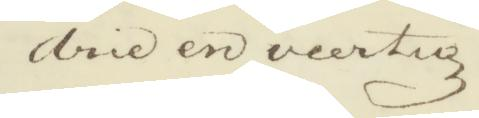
drie en veertig
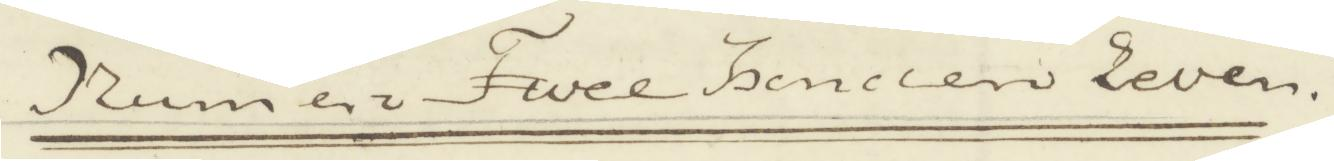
Numero Twee Honderd Zeven.
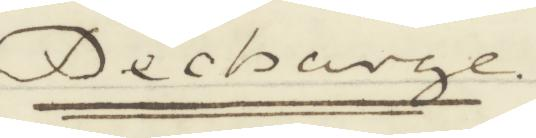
Decharge.
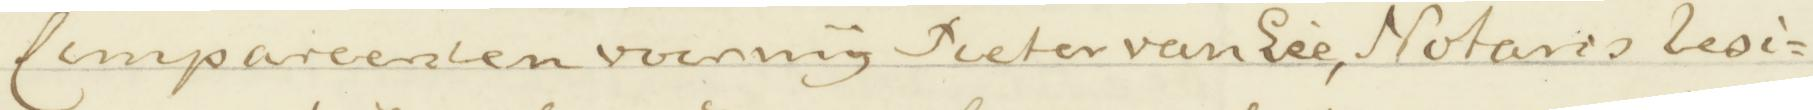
Compareerden voor mij Pieter van Lee Notaris resi=
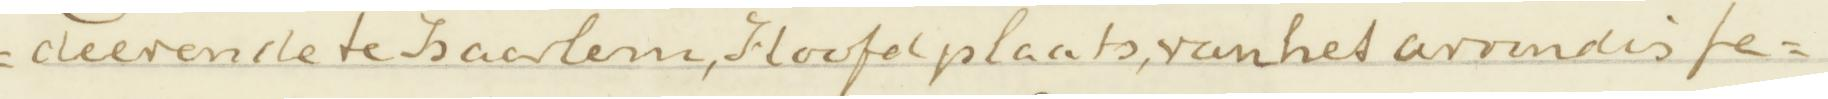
=deerende te haarlem, Hoofdplaats, van het arrondisse=
